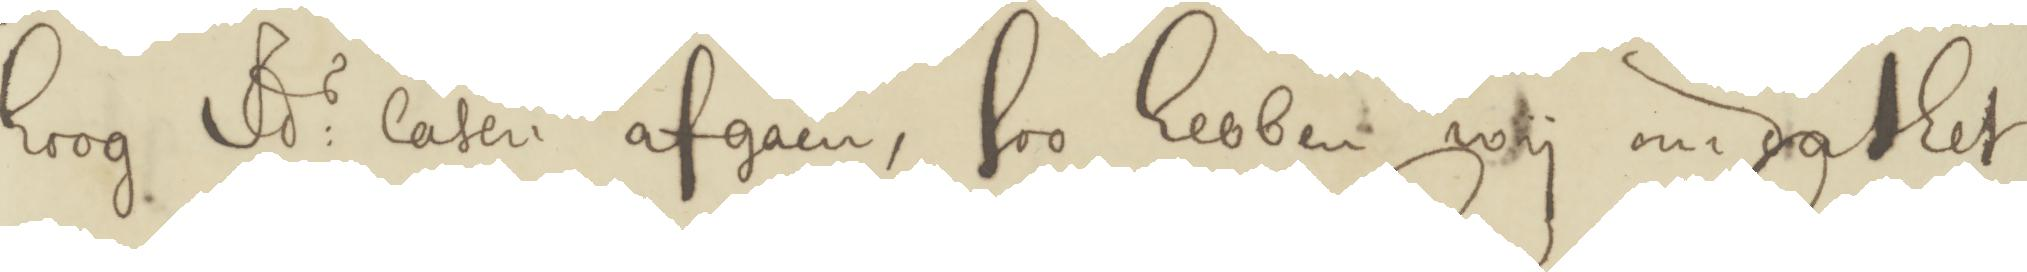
hoog Ed:s laten afgaen, soo hebben wij om dat het
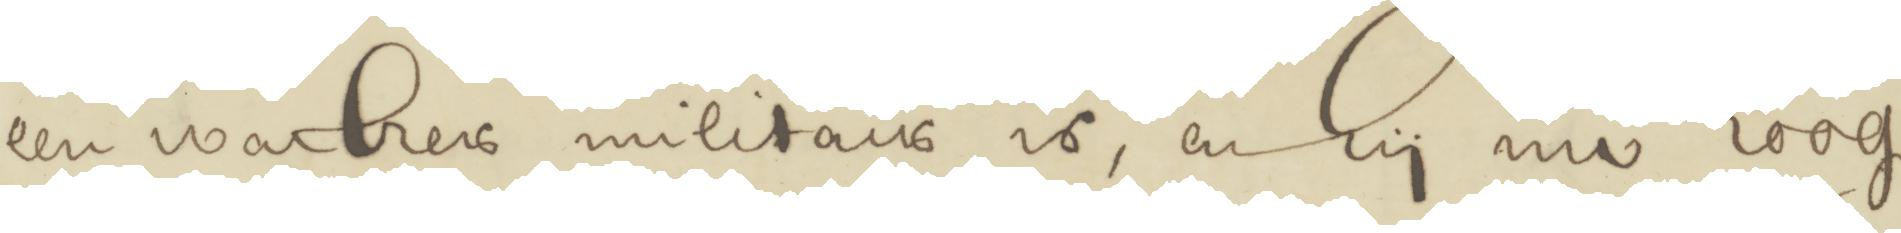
een wacker militair is, en hij uw hoog
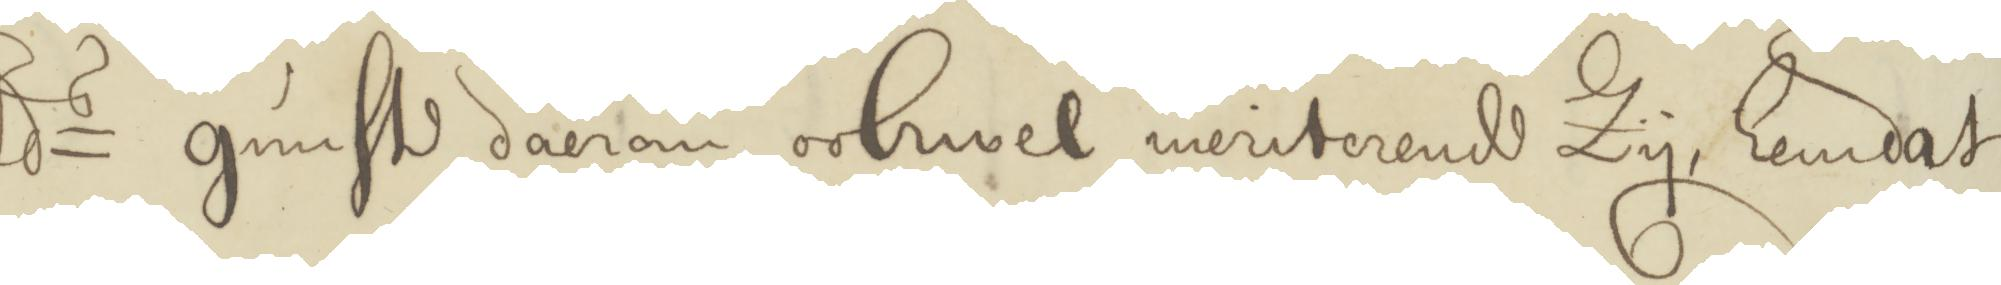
Ed=s gunste daerom ookwel meriterende zij, hem dat
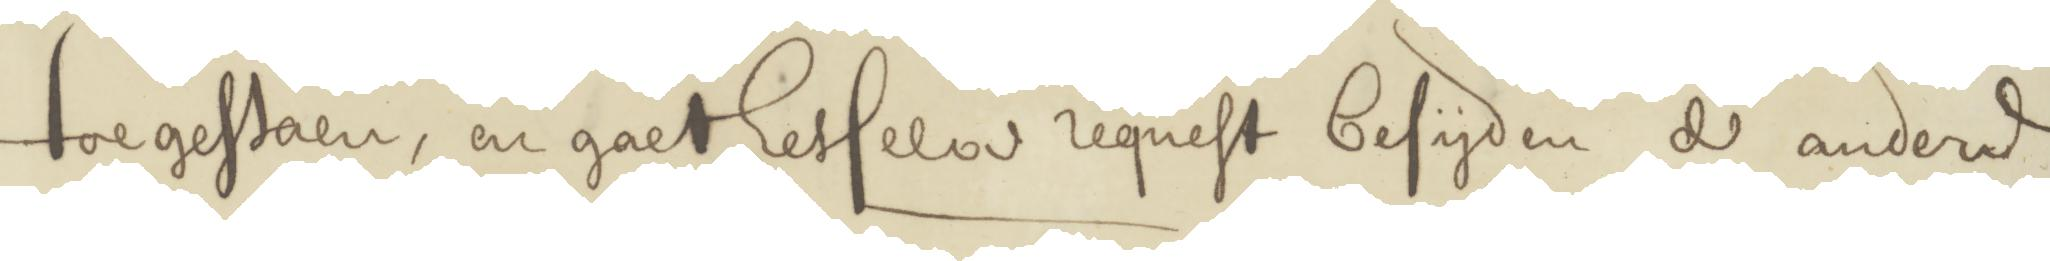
toe gestaen, en gaet het selve request besijden de andere
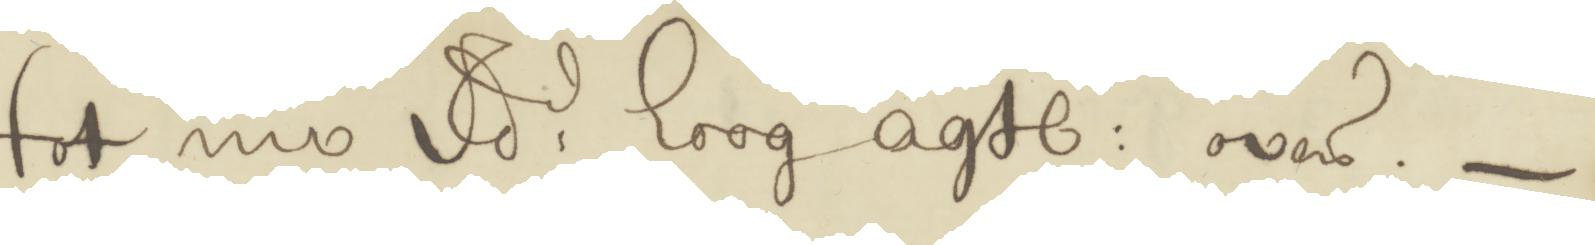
tot uw Ed:e hoog agtb: over. —
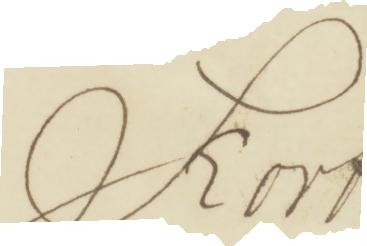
Kort
